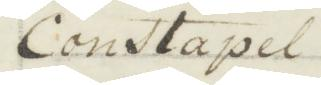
Constapel
